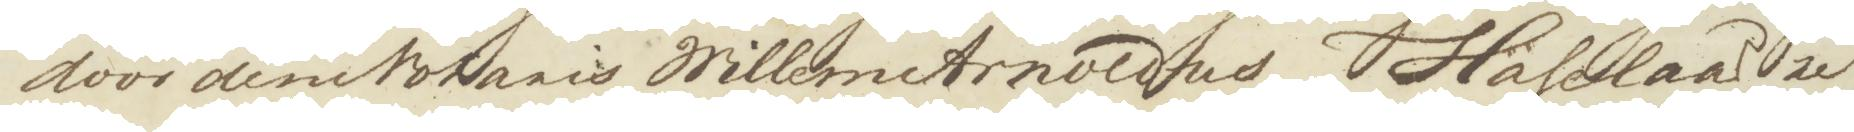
door den Notaris Willem Arnoldus Haselaar re
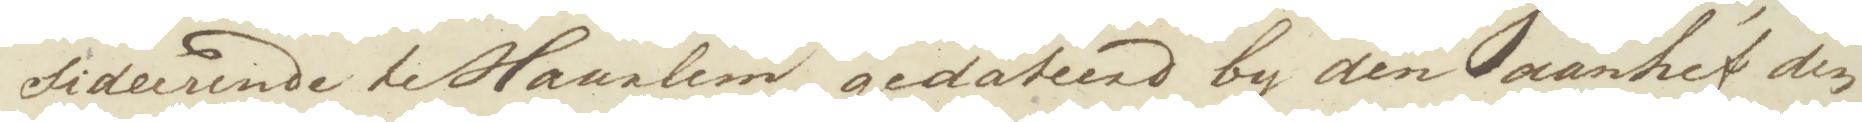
sideerende te Haarlem, gedateerd by den aanhef den
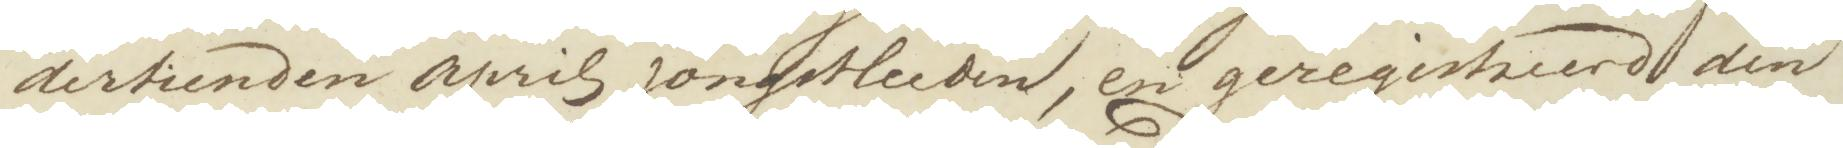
dertienden April jongstleeden, en geregistreerd den
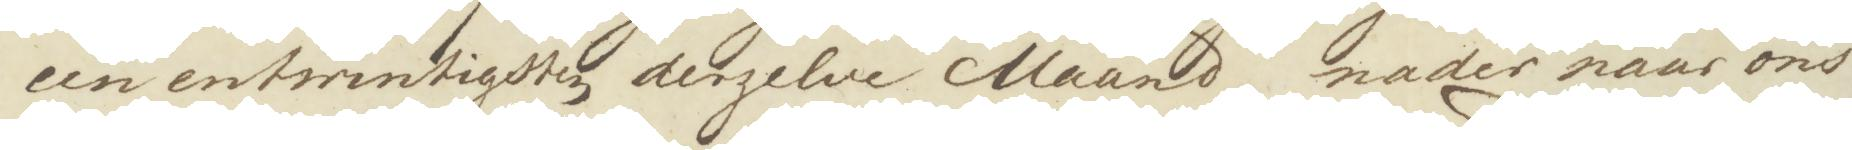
een en twintigsten derzelve Maand, nader naar ons
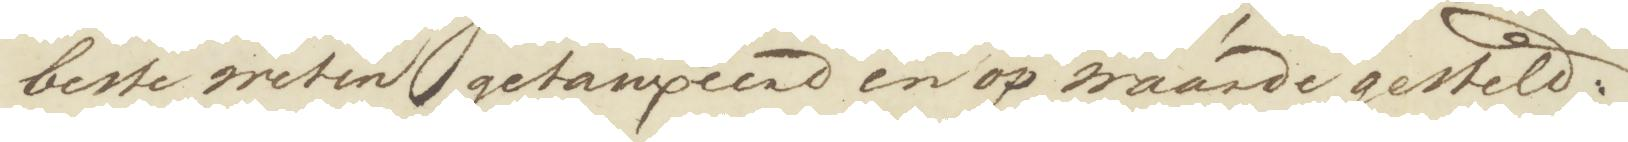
beste weten getauxeerd en op waarde gesteld:
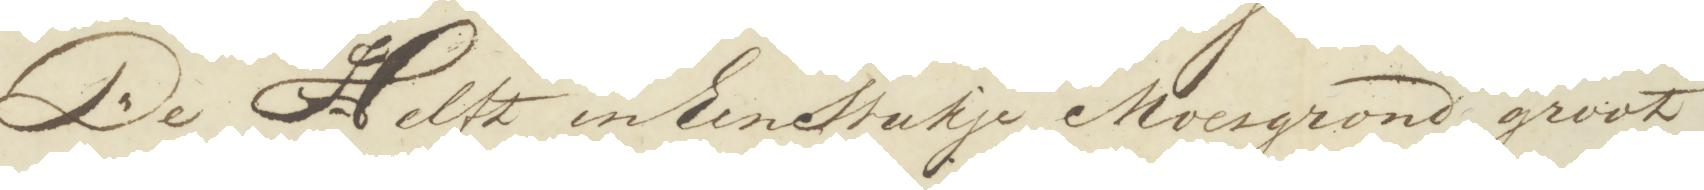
De Helft in Een stukje Moergrond, groot
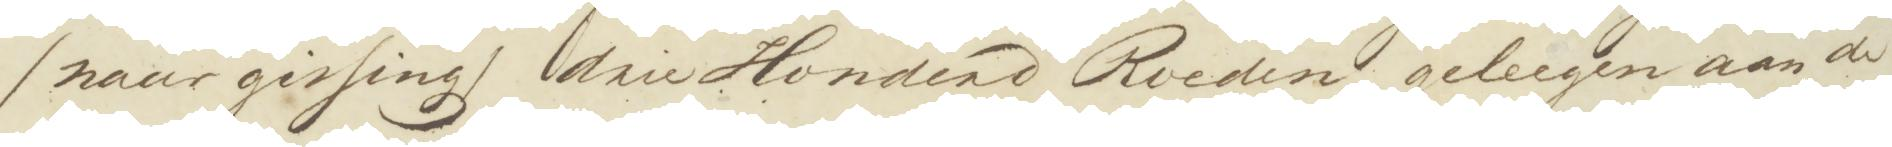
/ naar gissing / drie Honderd Roeden, geleegen aan de
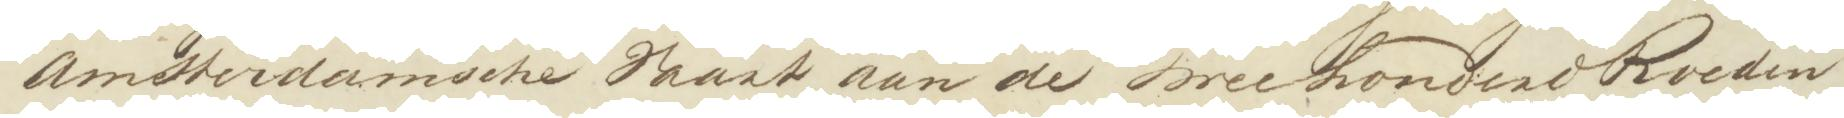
Amsterdamsche Vaart aan de Twee honderd Roeden
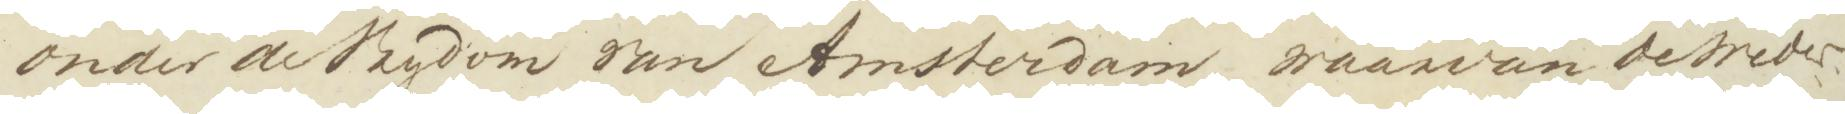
onder de Vrydom van Amsterdam, waarvan de weder„
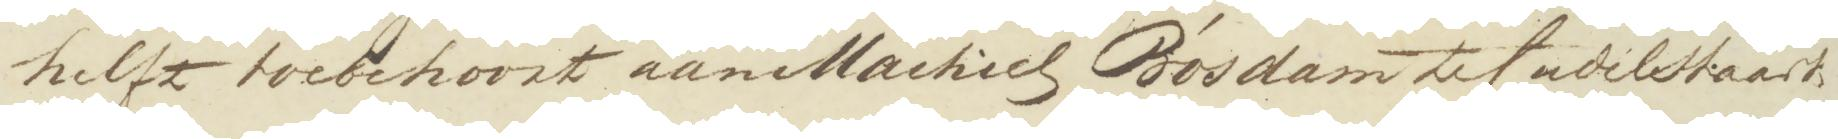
helft toebehoort aan Machiel Bosdam te Cudilstaart,
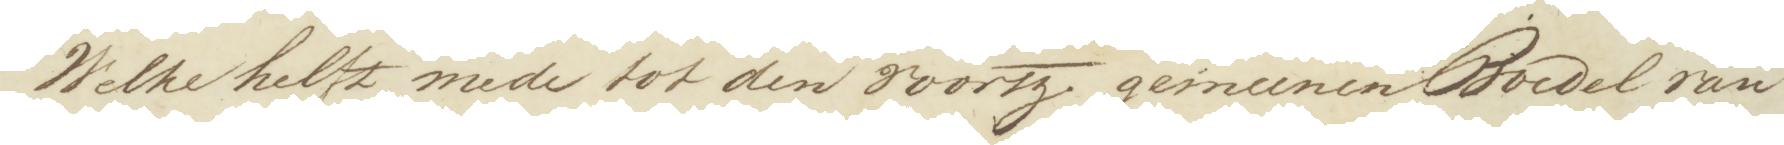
Welke helft mede tot den voorsz gemeenen Boedel van
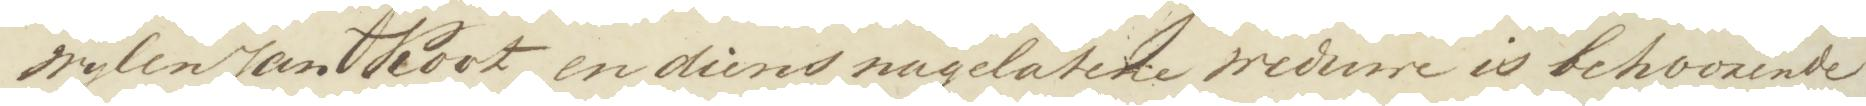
wylen Jan Koot, en diens nagelatene weduwe is behoorende,
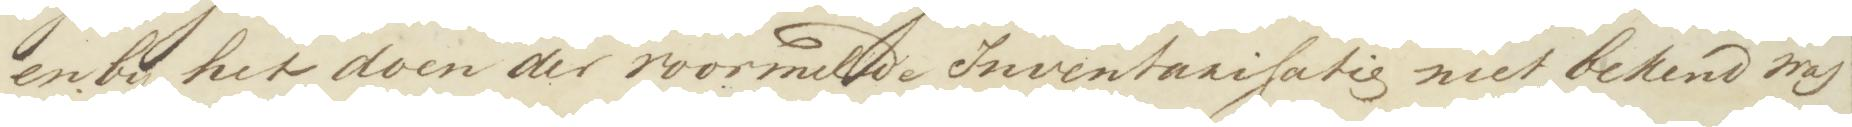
en by het doen der voormelde Inventarisatie niet bekend was
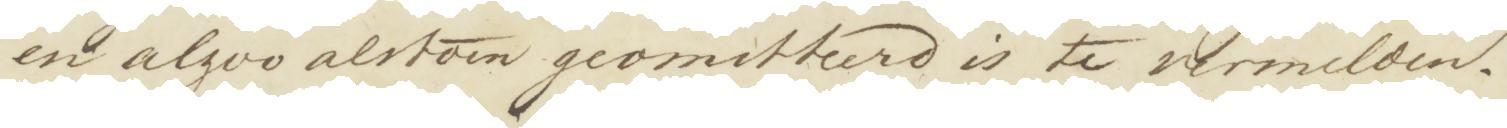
en alzoo als toen geomitteerd is te vermelden.
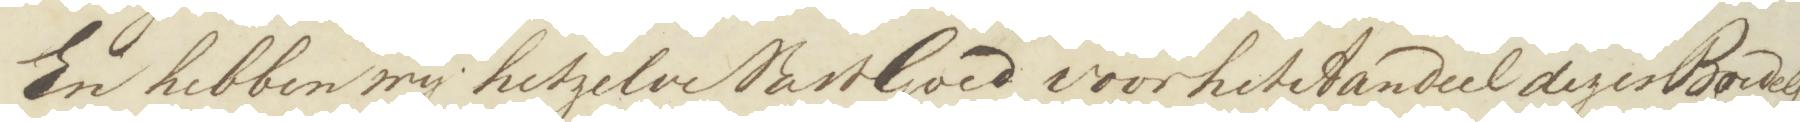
En hebben wy hetzelve Vast Goed voor het Aandeel dezes Boedels,
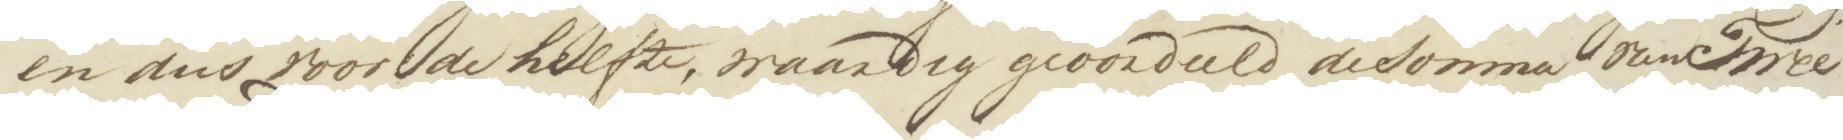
en dus voor de helfte, waardig geoordeeld de somma van Twee
